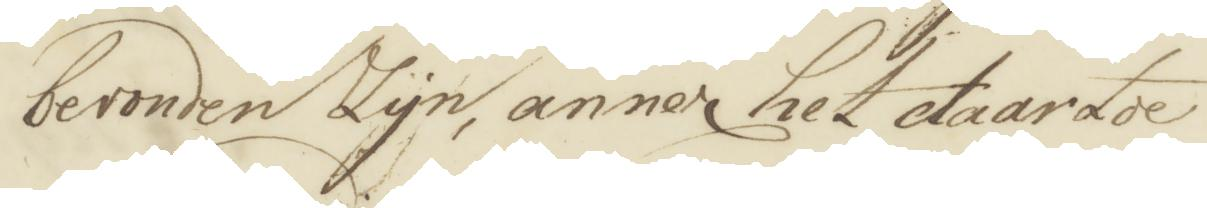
bevonden zijn, annex het daartoe
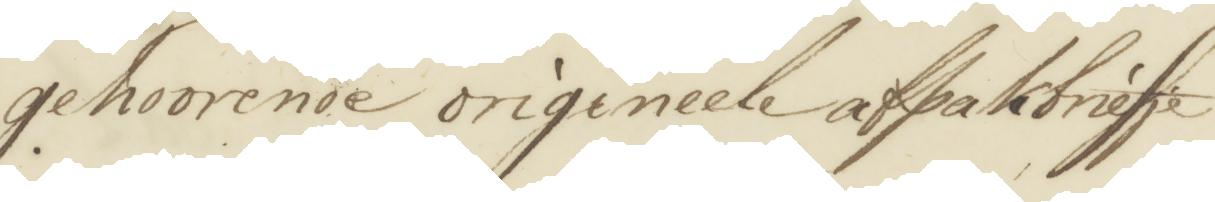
gehoorende origineele afpakbriefje
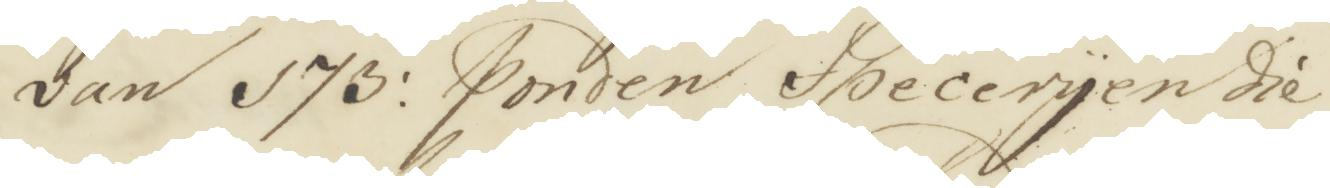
20 „ d„ van 173: ponden specerijen die
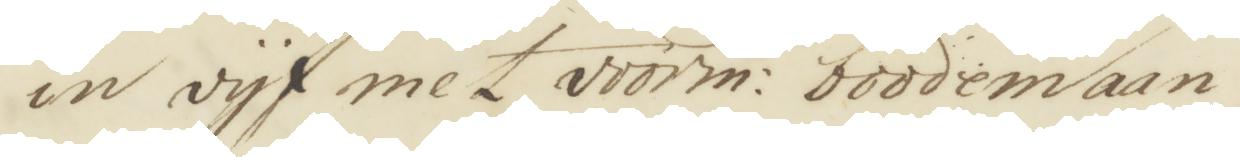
in vijf met voorm: boodem aan
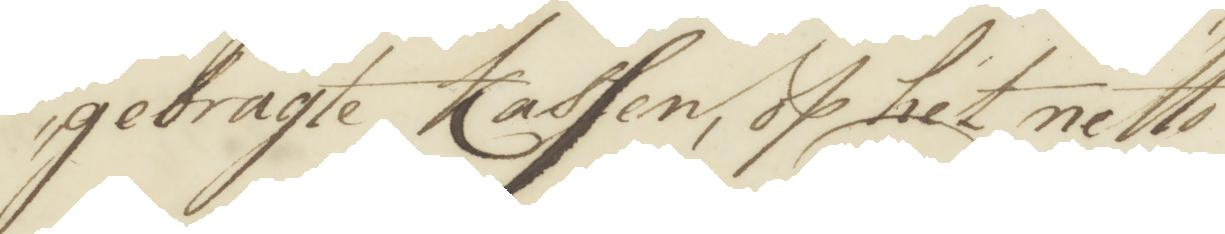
„gebragte kassen, op het netto
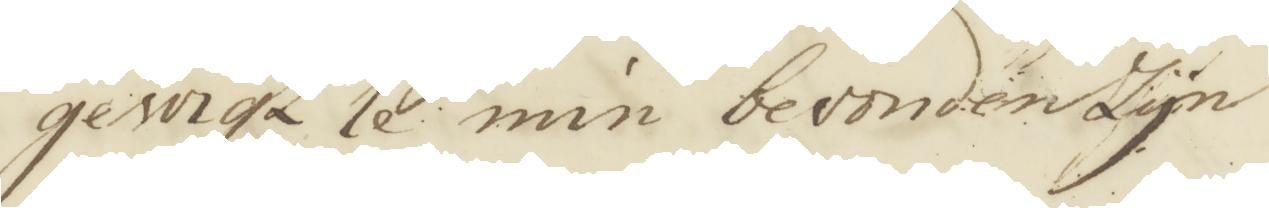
gewigt te min bevonden zijn
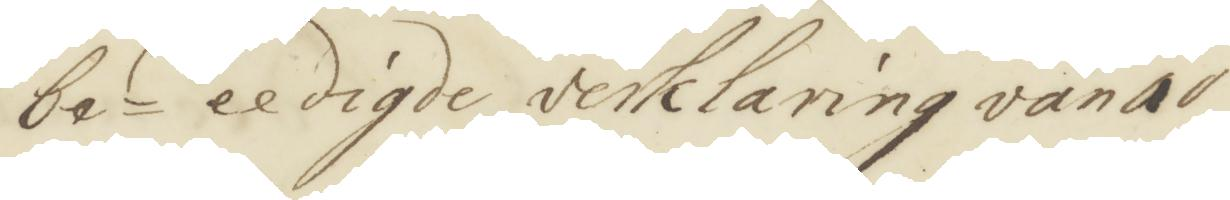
21 „ d„ be=eedigde verklaring van 40
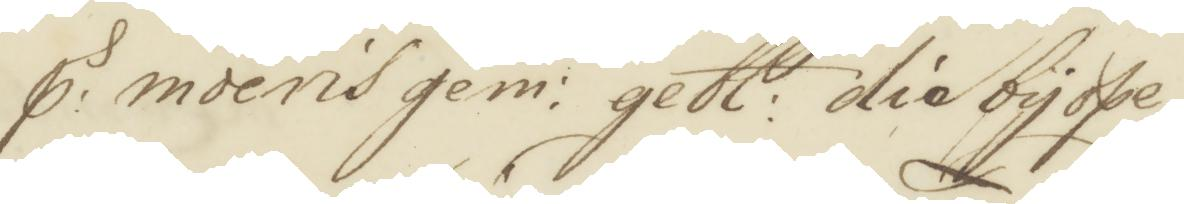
p„s moeris gem: gebl: die bij ope
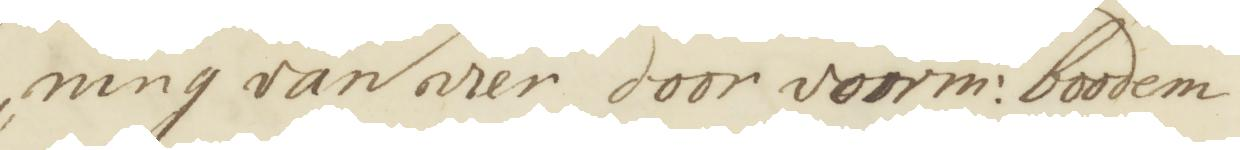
„ning van over door voorm: boodem
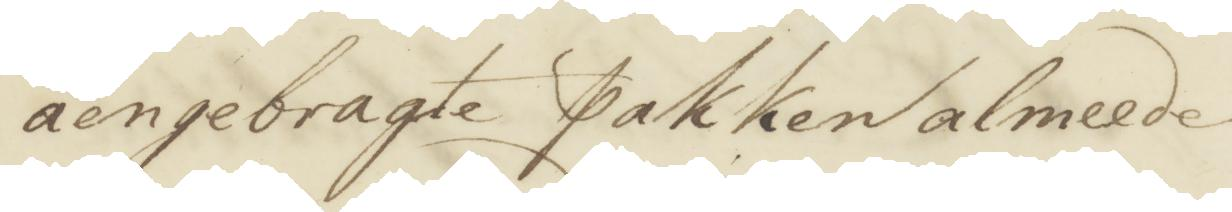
aengebragte pakken almeede
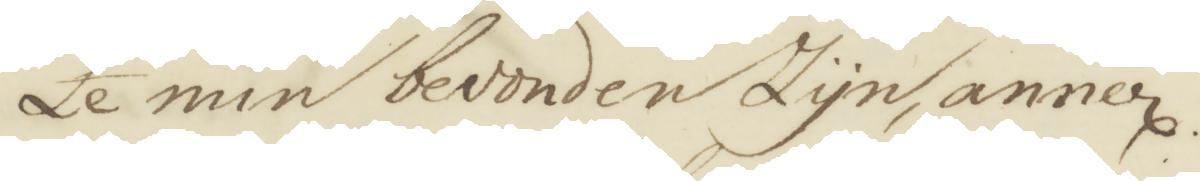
te min bevonden zijn, annex
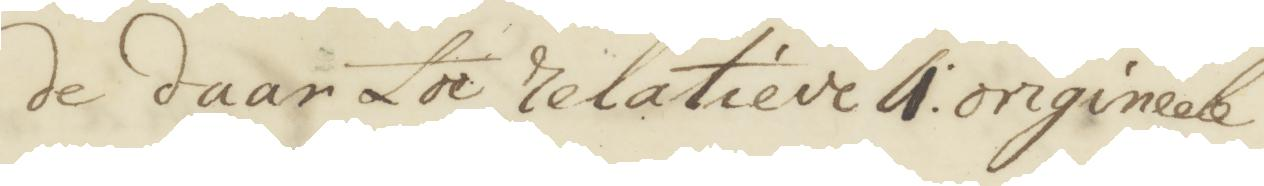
de daar toe relatieve 4: origineele
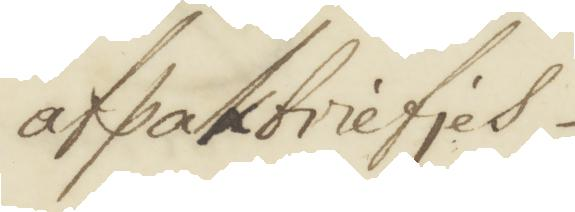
afpakbriefjes
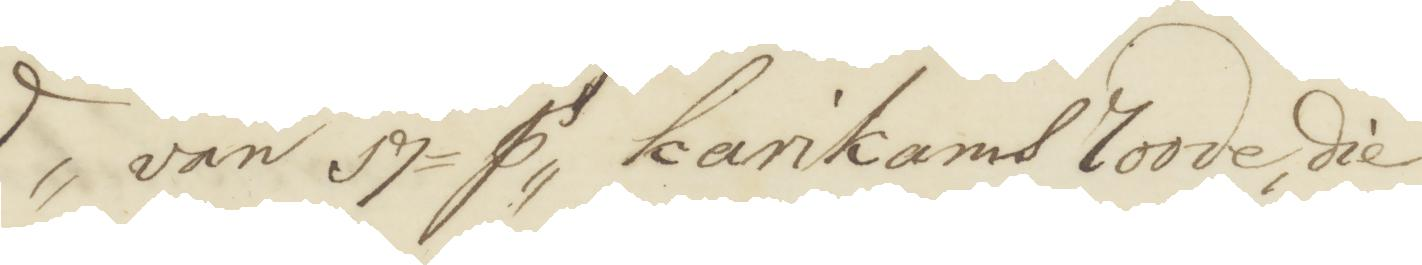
„22 „ d„ van 17 p„s karikams roode, die
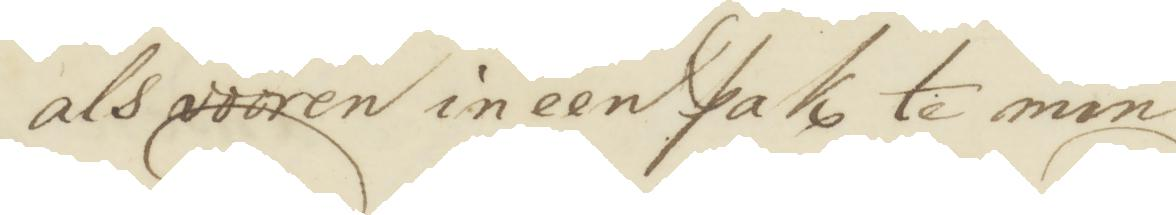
als vooren in een pak te min
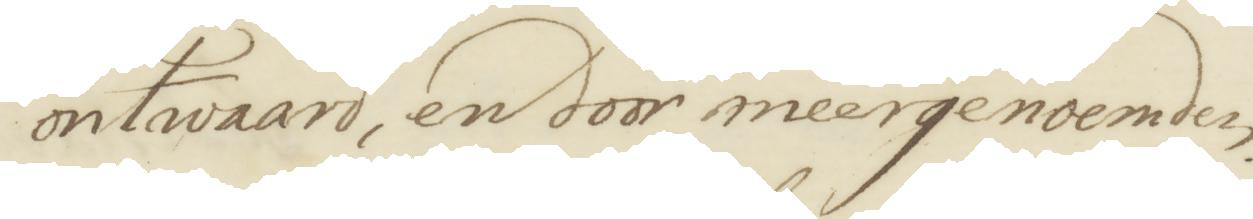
ontwaard, en door meergenoemden
